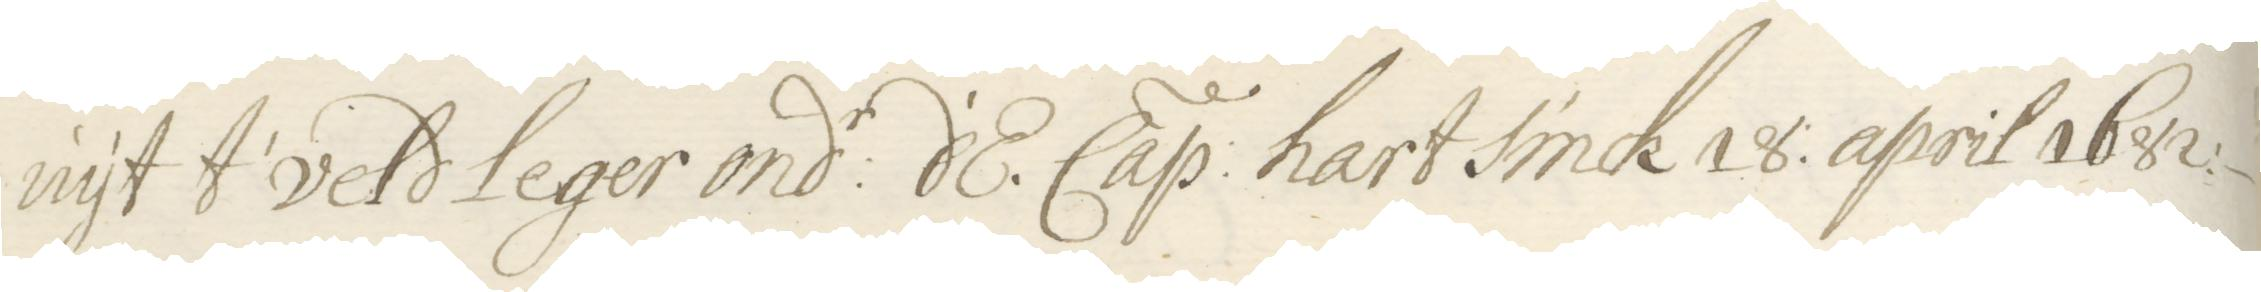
uijt t'veld leger ond:r d'E. Cap:e hartsinck 18. april 1682:
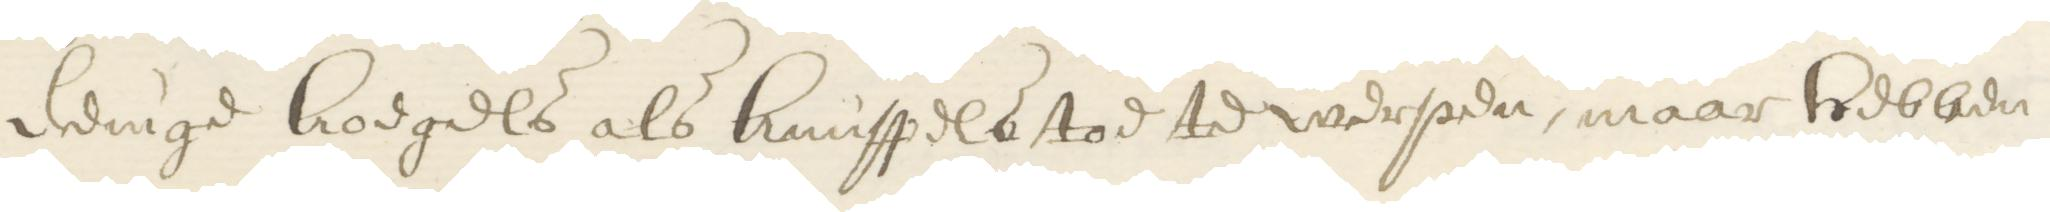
Eenige koegels als knuppels toe te werpen, maar hebben
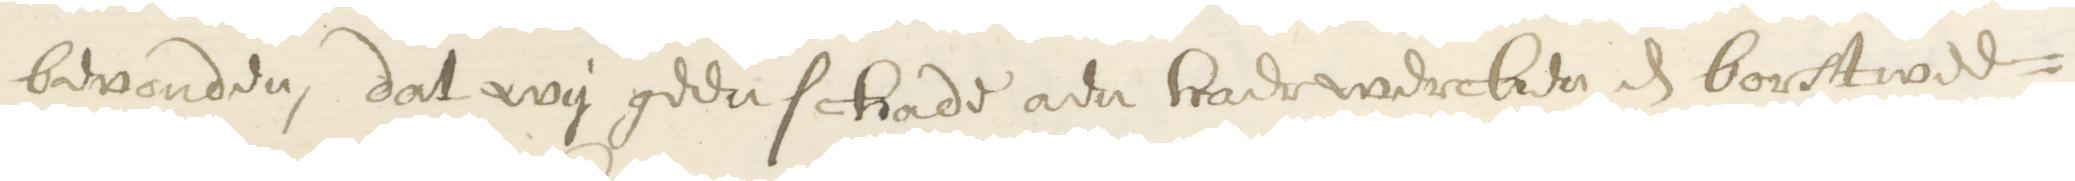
bevonden, dat wij geen schade aen haerwercken en borstwee=
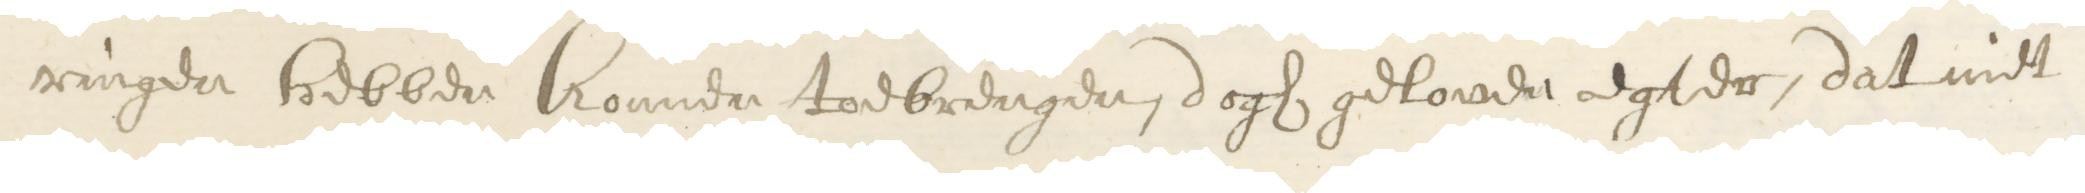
ringen hebben konnen toebrengen, dogh geloven egter, dat niet
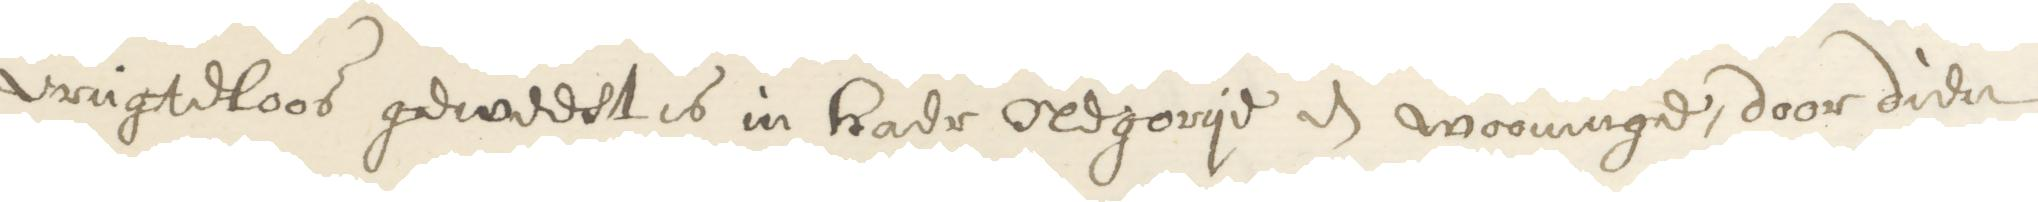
vrugteloos geweest is in haer negorije en wooninge, door dien
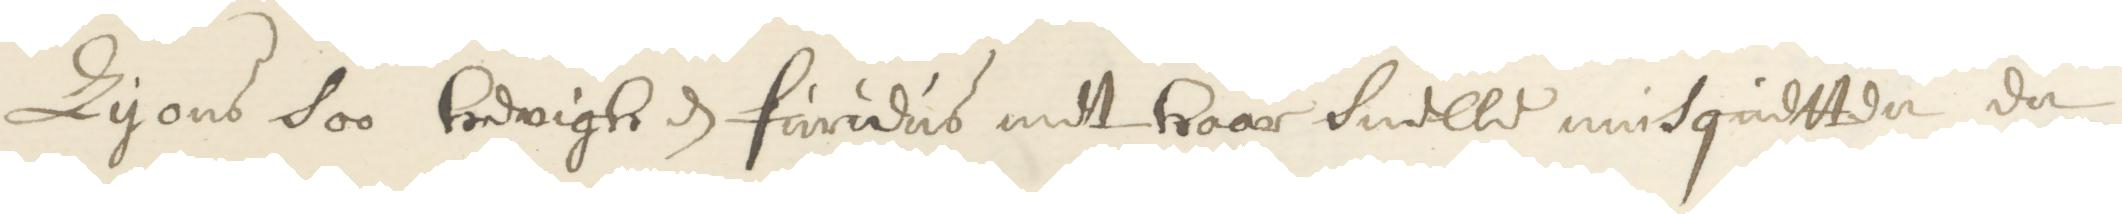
zij ons soo hevigh en furieus nens met haar snelle musquetten en
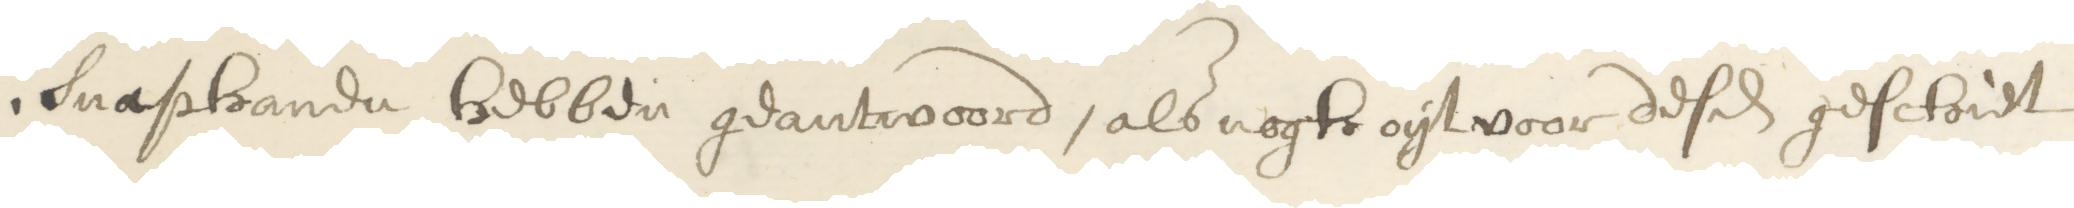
. snaphanen hebben geantwoord, als nogh oijt voor desen geschiet
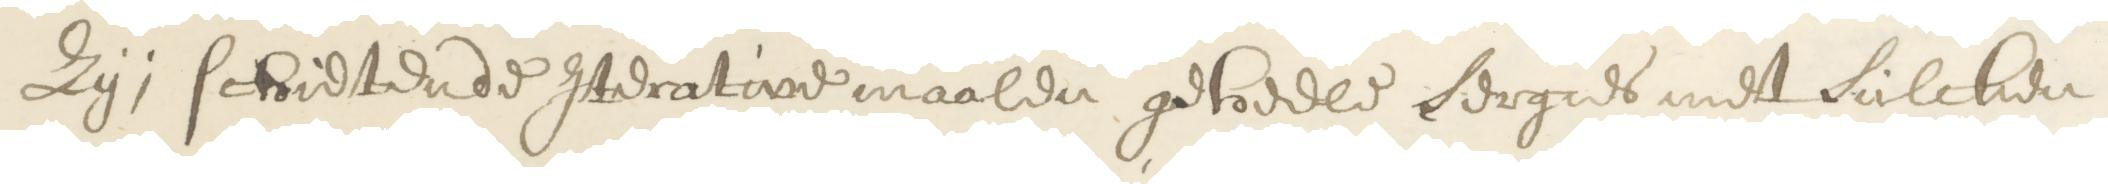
zij; schietende Iterative maalen geheele sergies met sulcken
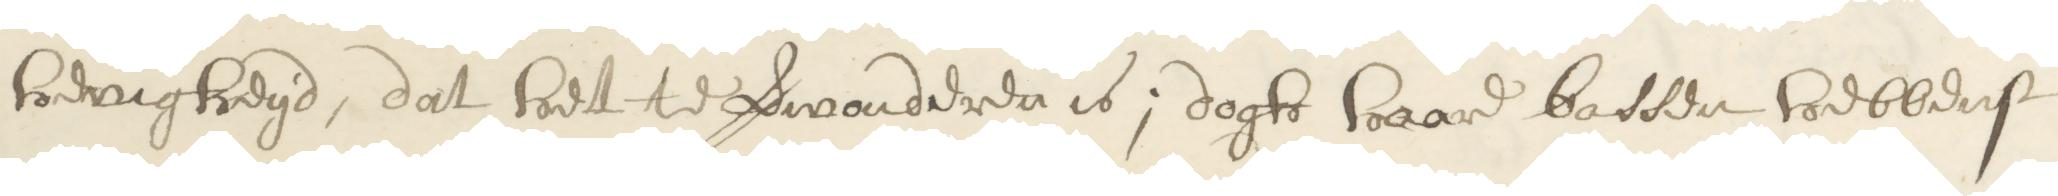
hevigheijd, dat het te verwonderen is; dogt haare bassen hebbenst
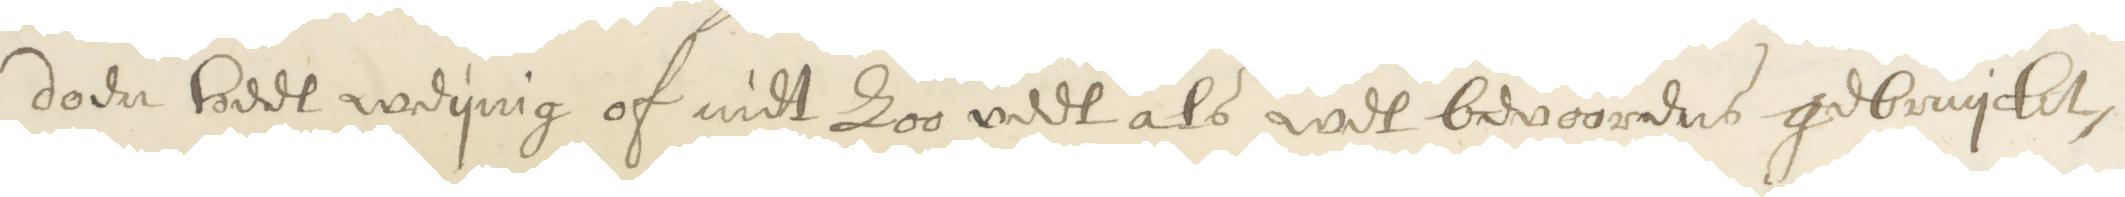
doen heel weijnig of niet zoo veel als wel bevoorens gebruijckt,
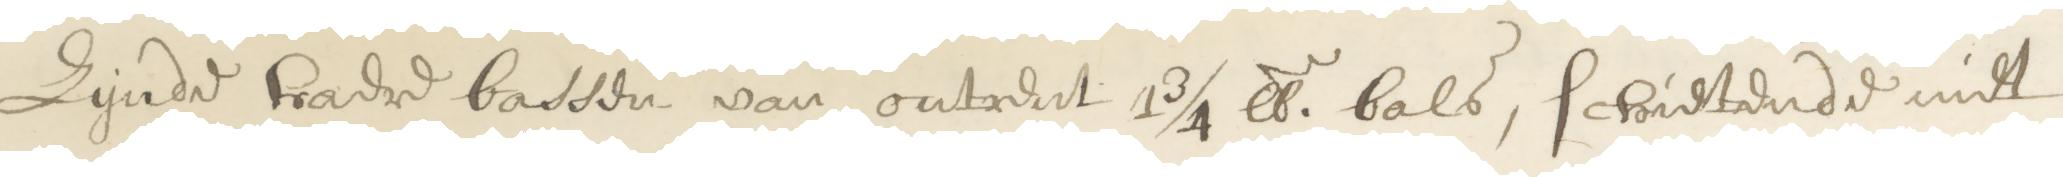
zijnde haere bassen van ontrent 1¾ lb. bals, schietende niet
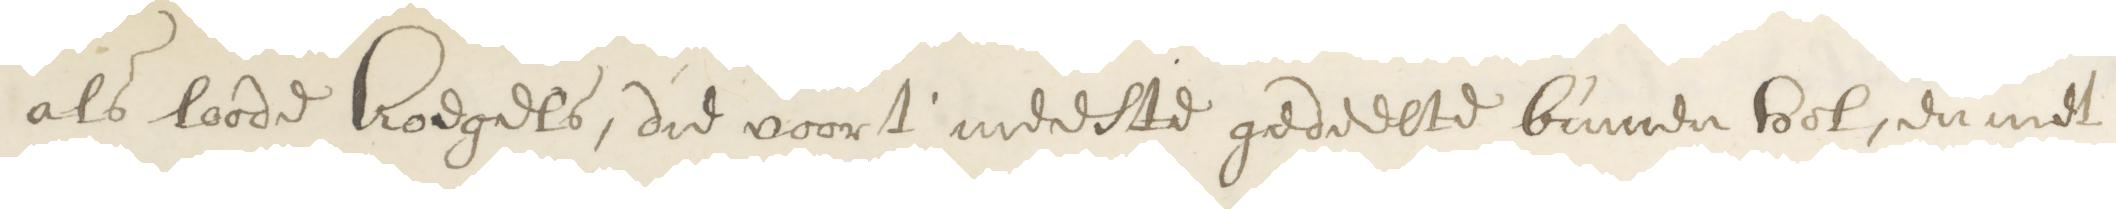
als loode koegels, die voor t' meeste gedeelte binnen hol, en met
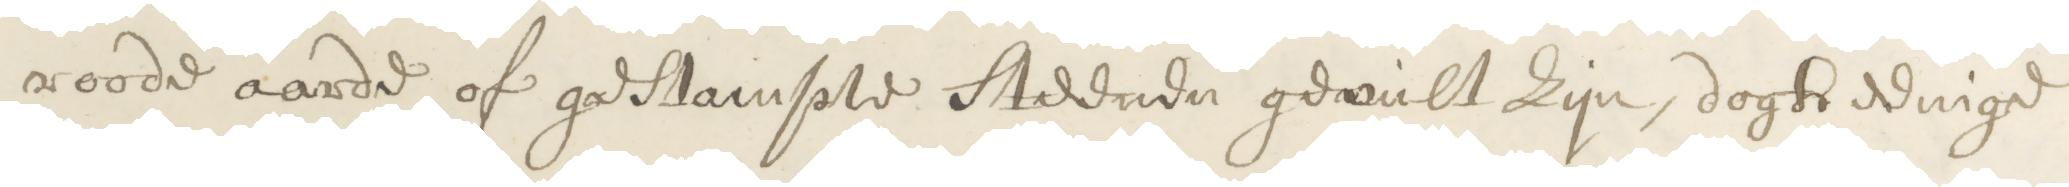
roode aarde of gestampte steenen gevult zijn, dogh eenige
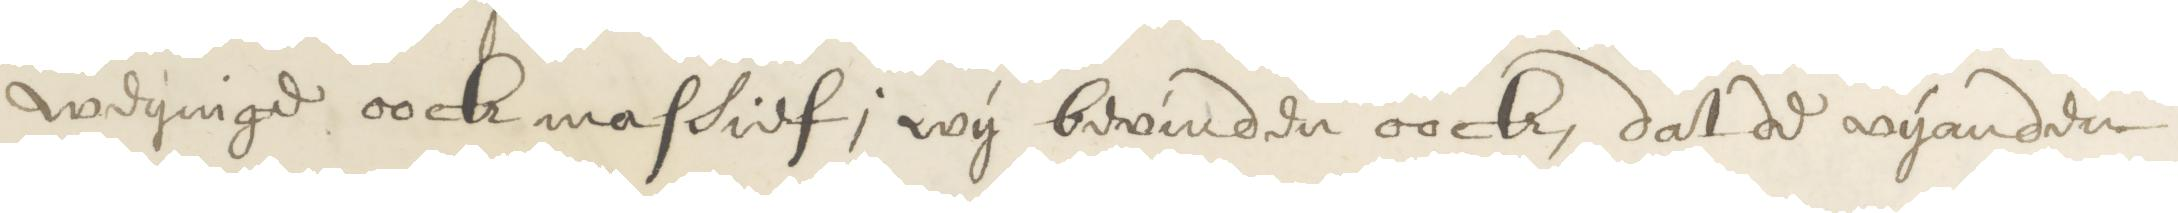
weijnige oock massief; wij bevinden oock, dat de vijanden
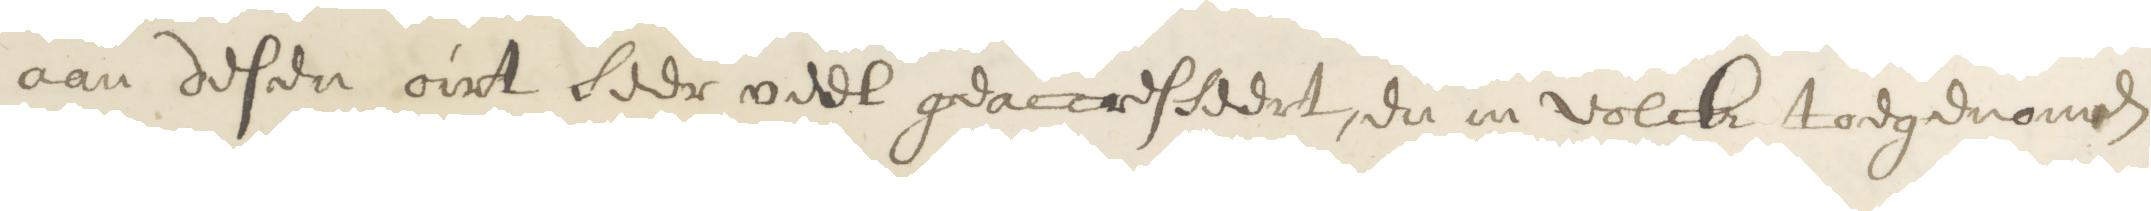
aan desen oirt seer veel geaccresseert, en in volck toegenomen
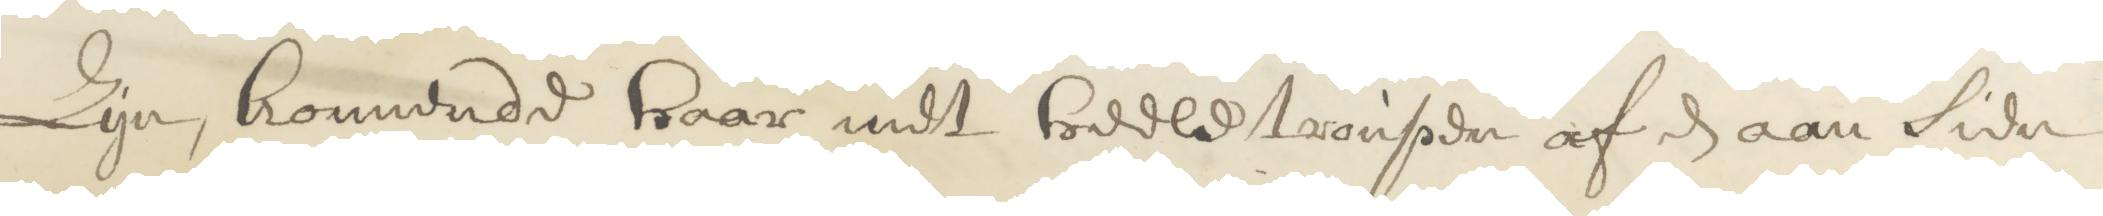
zijn, konnende haar met heele troupen af en aan sien
